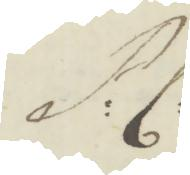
P:C:
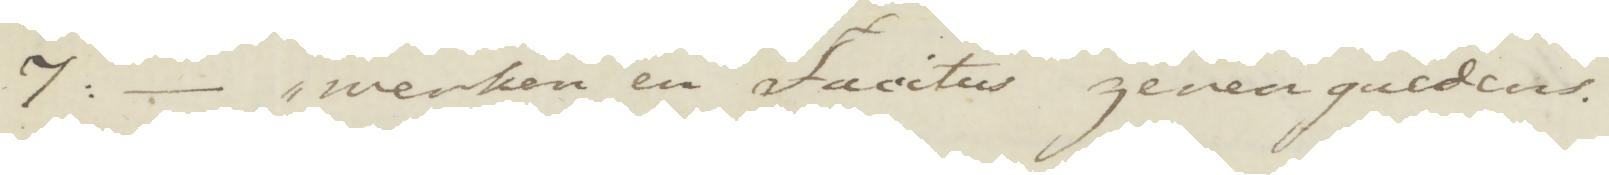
7: — „ werken en Facitus zeven guldens.
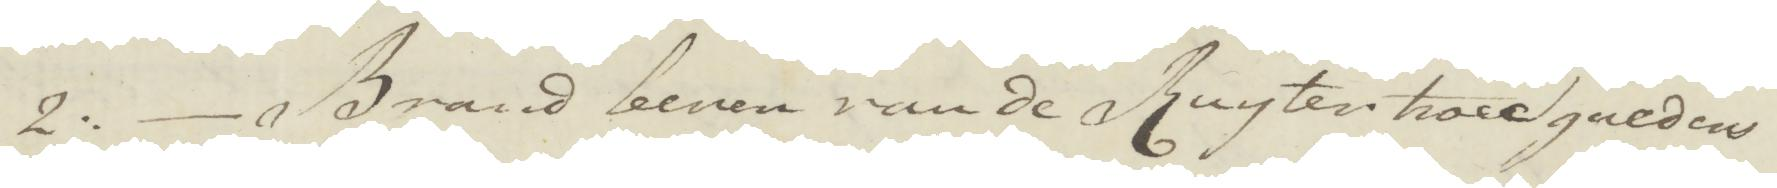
2: — Brand leenen van de Ruyter twee guldens
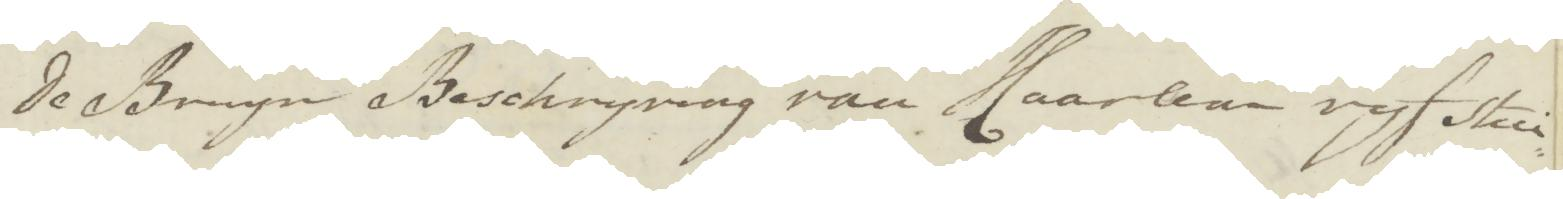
de Bruyn Beschryving van Haarlem vyf stui„
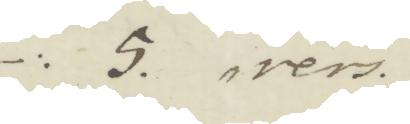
—:5. „vers.
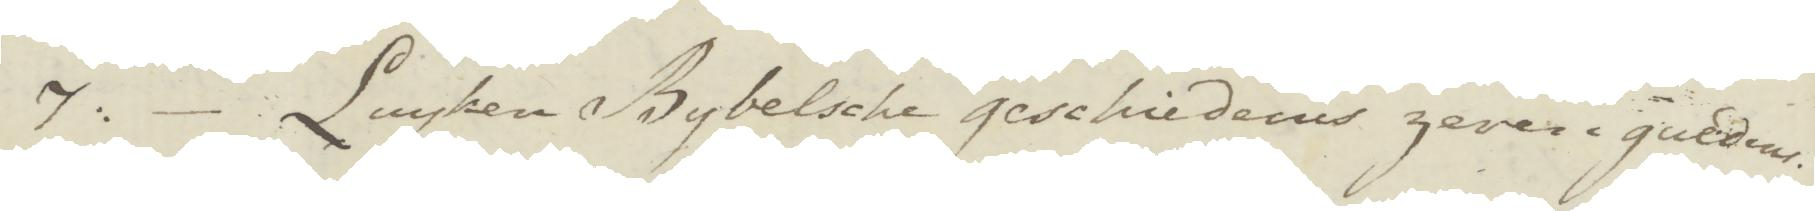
7: — Luyken Bijbelsche geschiedenis zeven guldens.
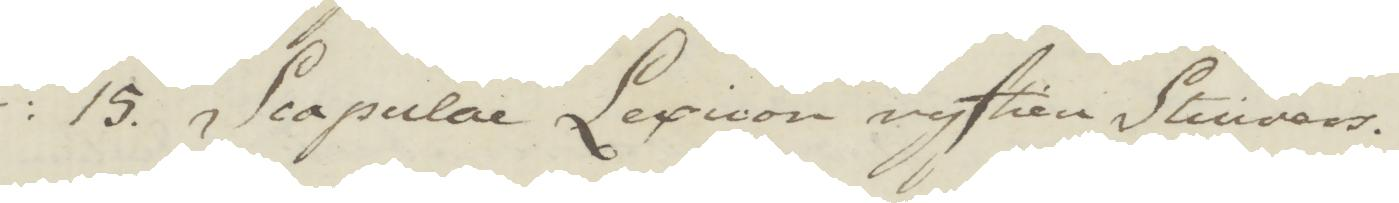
: 15. Scapulae Lexicon vyftien Stuivers.
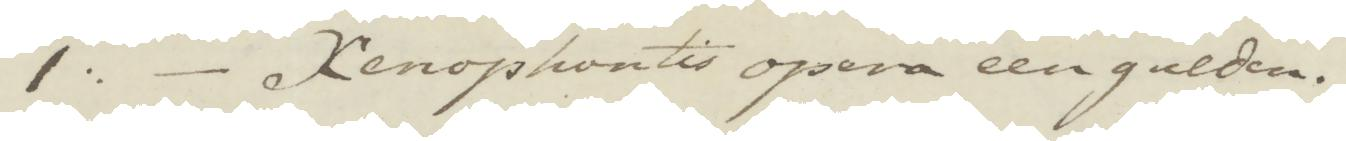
1 : — Kenophontis opera een gulden.
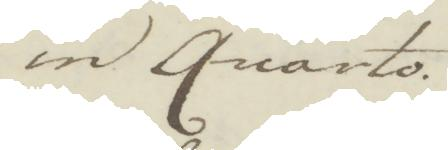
in Quarto.
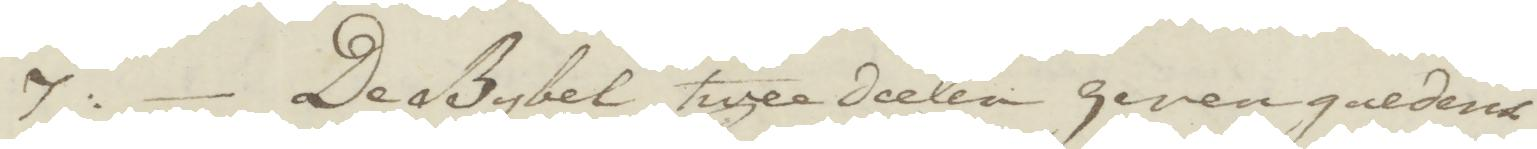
7: — De Bybel twee deelen zeven guldens.
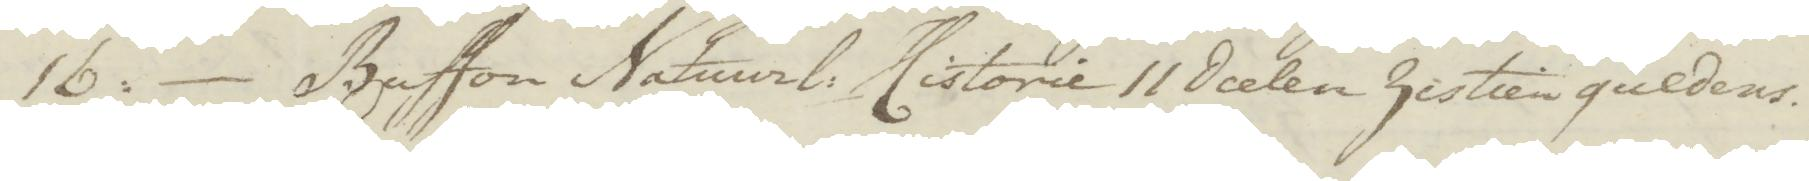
16: — Buffon Natuurl: Historie 11 deelen zestien guldens.
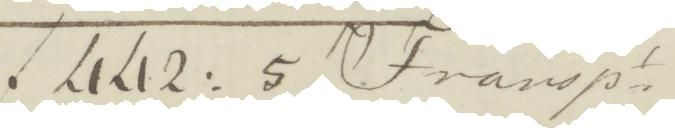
ƒ 442: 5 Transp„t
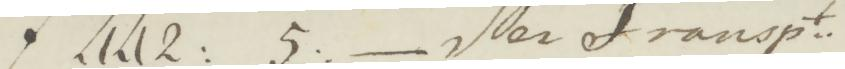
ƒ 442: 5: — Per Transp„t.
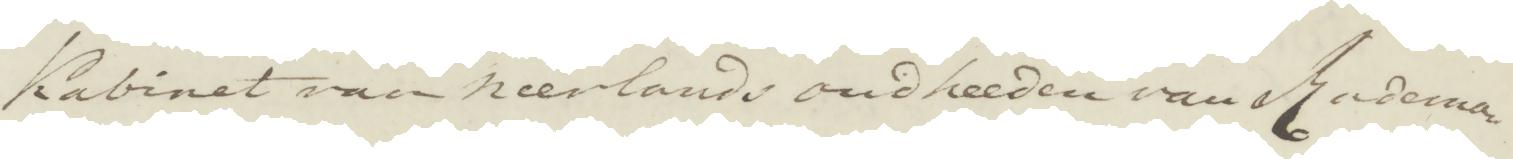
Kabinet van neerlands oudheeden van Radema
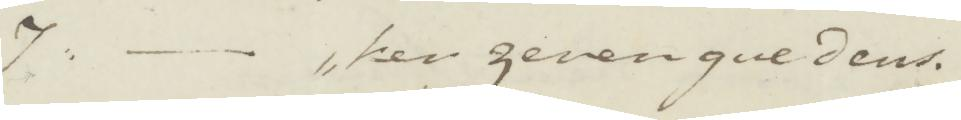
7: — „ker zeven guldens.
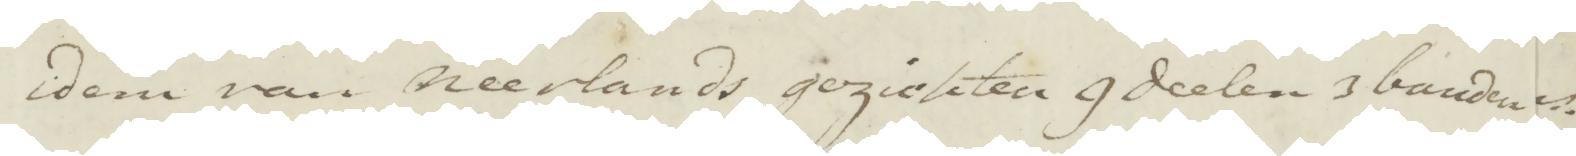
idem van neerlands gezichten 9 deelen 3 banden
